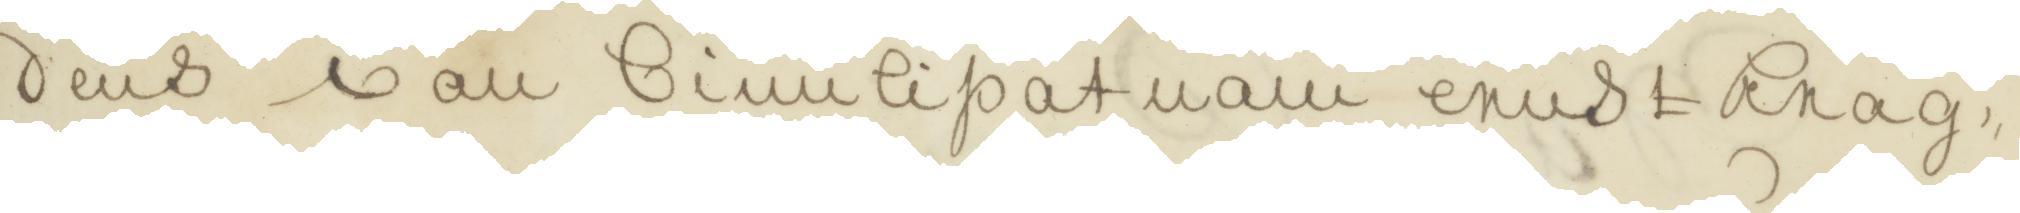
dens van bimilipatnam ernst krag„
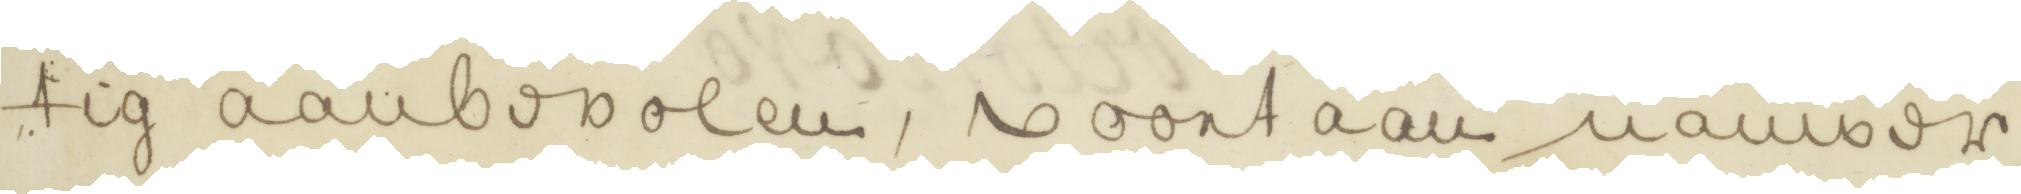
„tig aanbevolen, voortaan nauwer
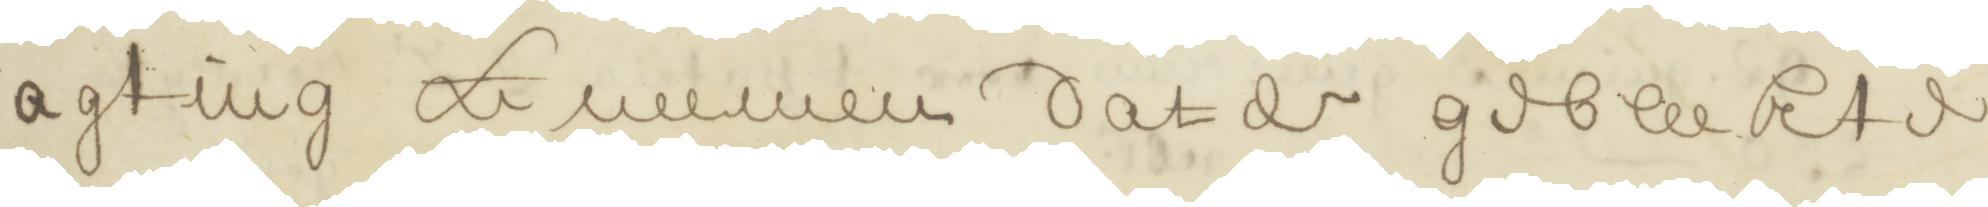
agting te neemen dat de gebleekte
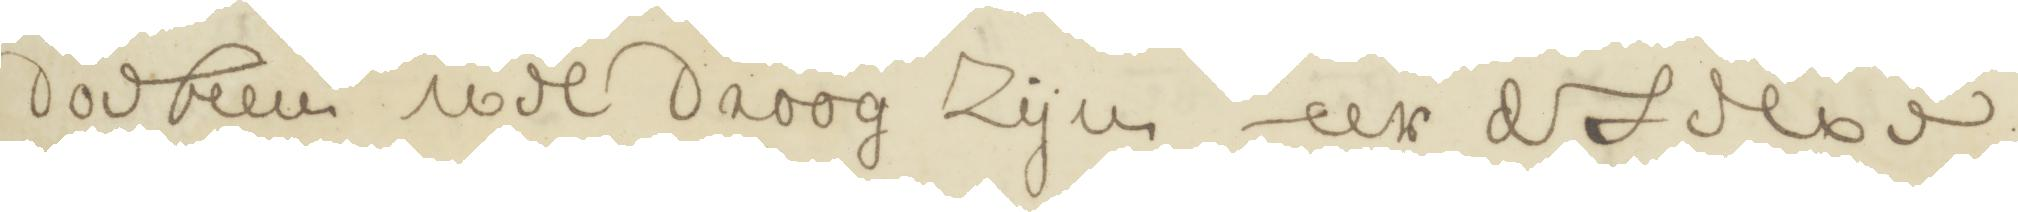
doeken wel droog Zijn eer deselve
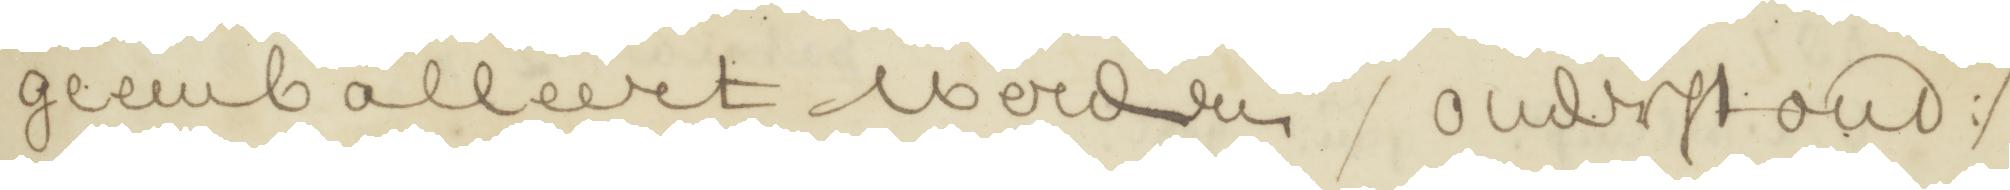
geemballeert werden /onderstond :/
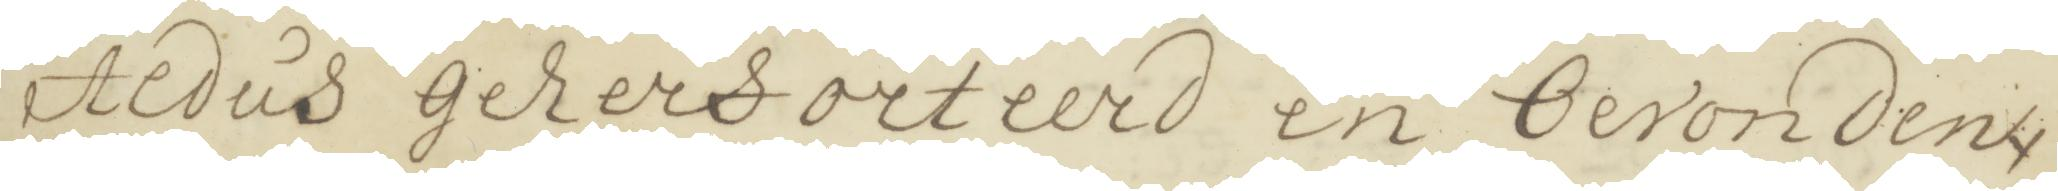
Aldus gehersorteerd en bevonden,
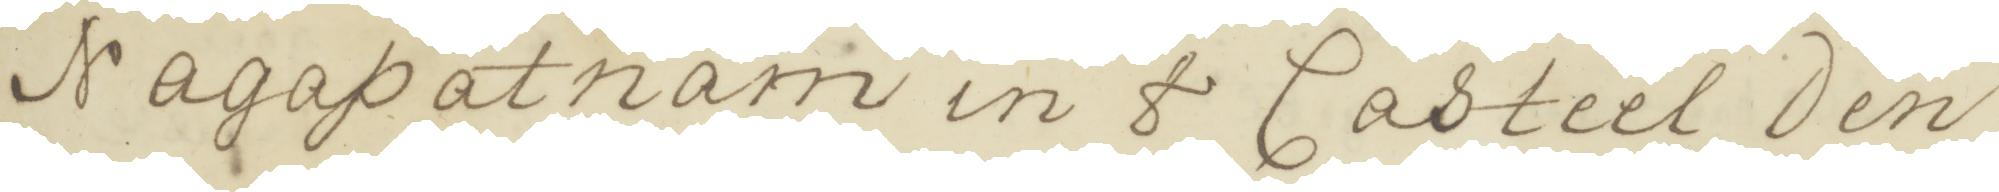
Nagapatnam in t Casteel den
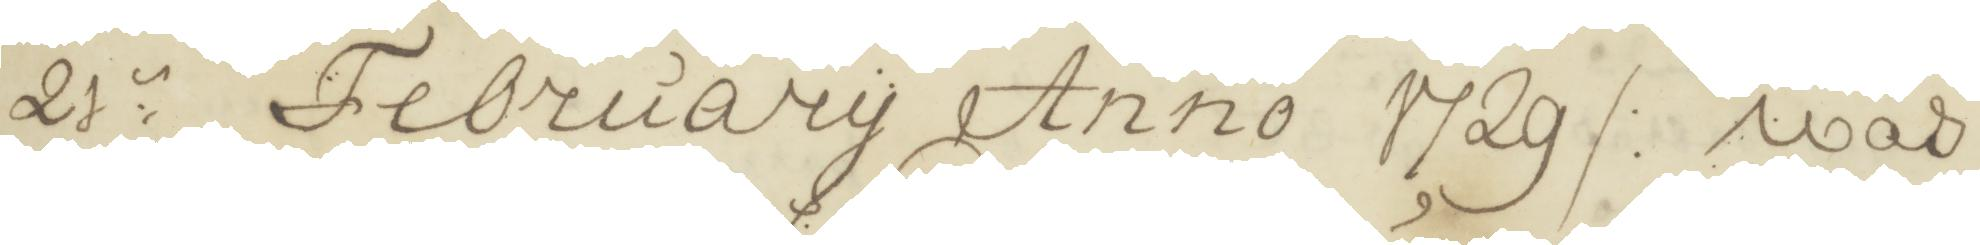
21:e Februarij Anno 1729 /: was
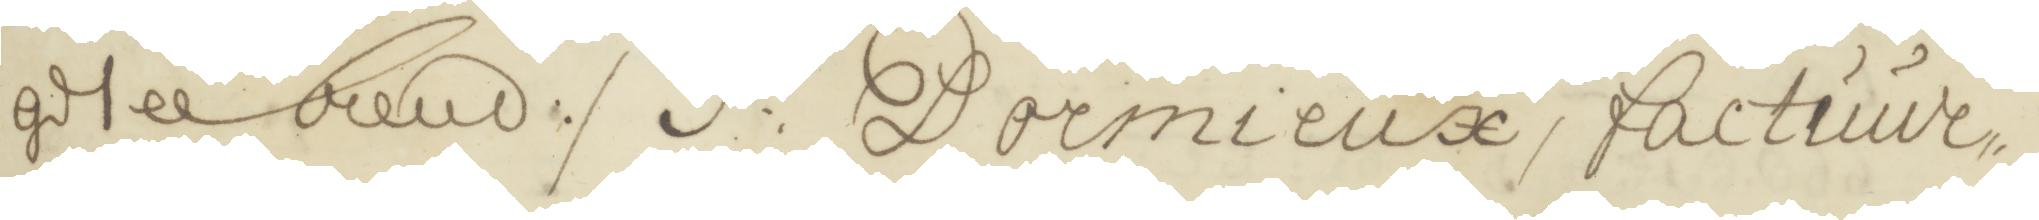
geteekend:/ I:s Dormieux, factuur„
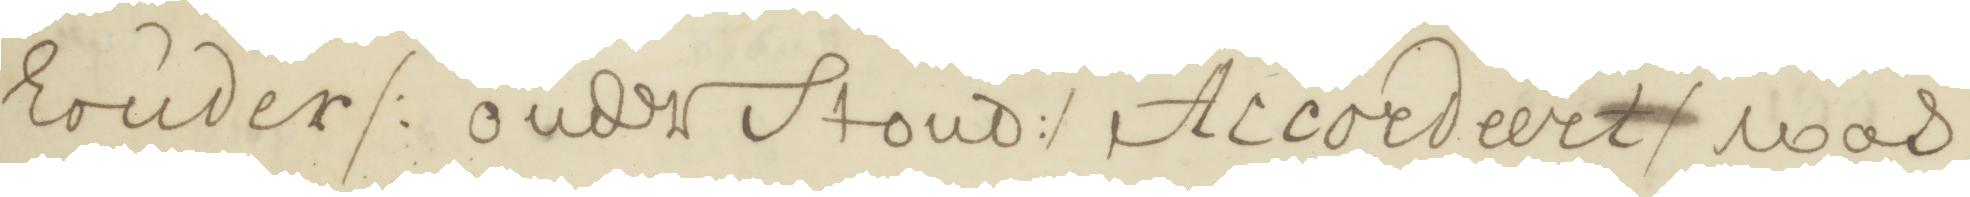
houder /: onderstond:/ Accordeert /was
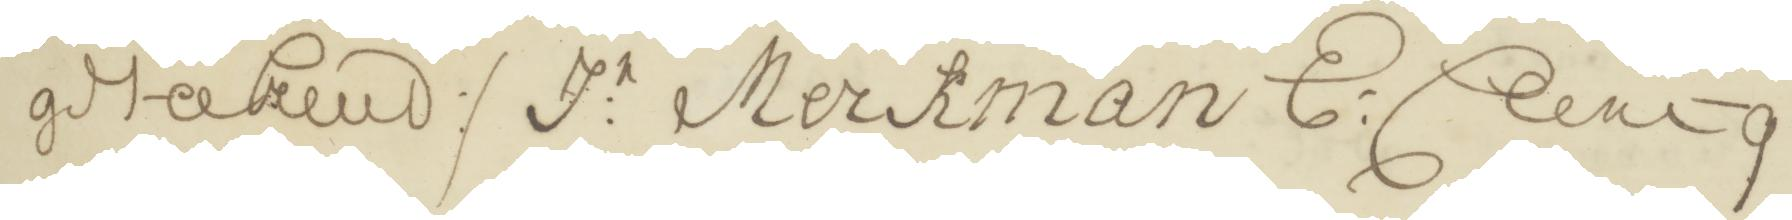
geteekend:/ I:r Merkman E: Clercq
